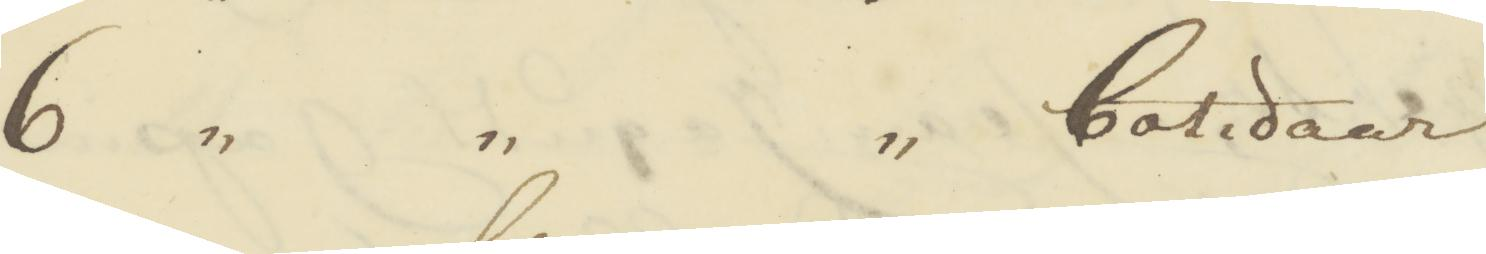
6 „ „ „ botidaar
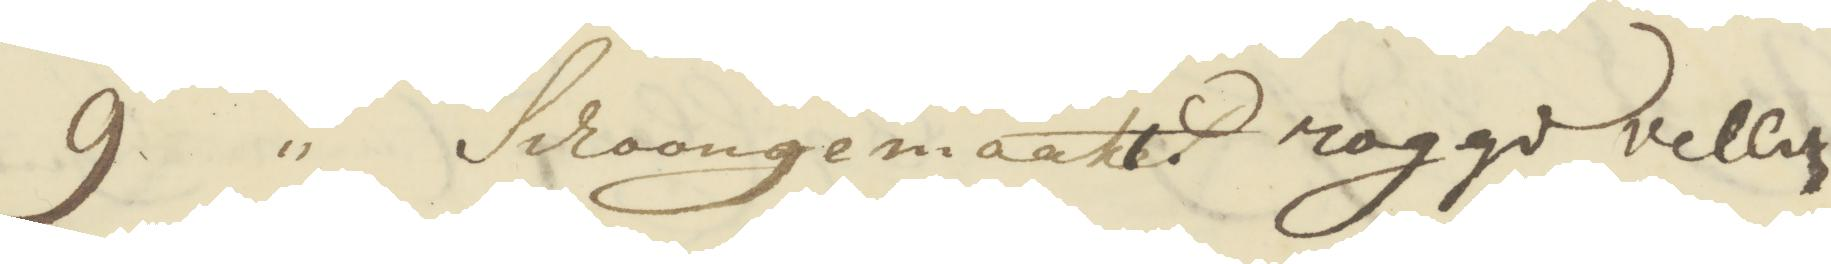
9 „ schoon gemaakts rogge vellen
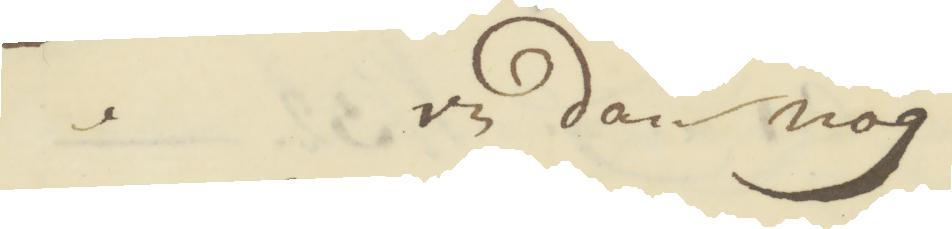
- en dan nog
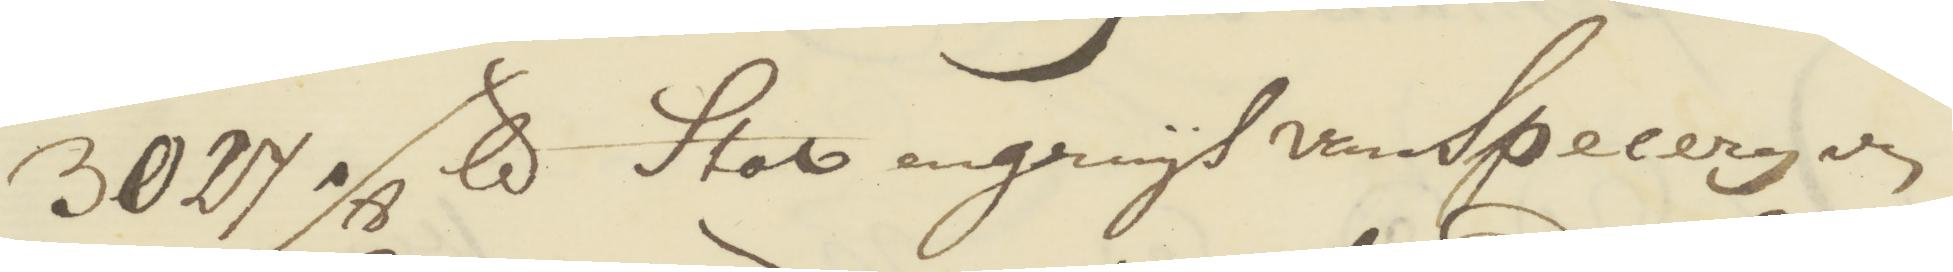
3027 1/8 lb stov en gruijs van speceryen
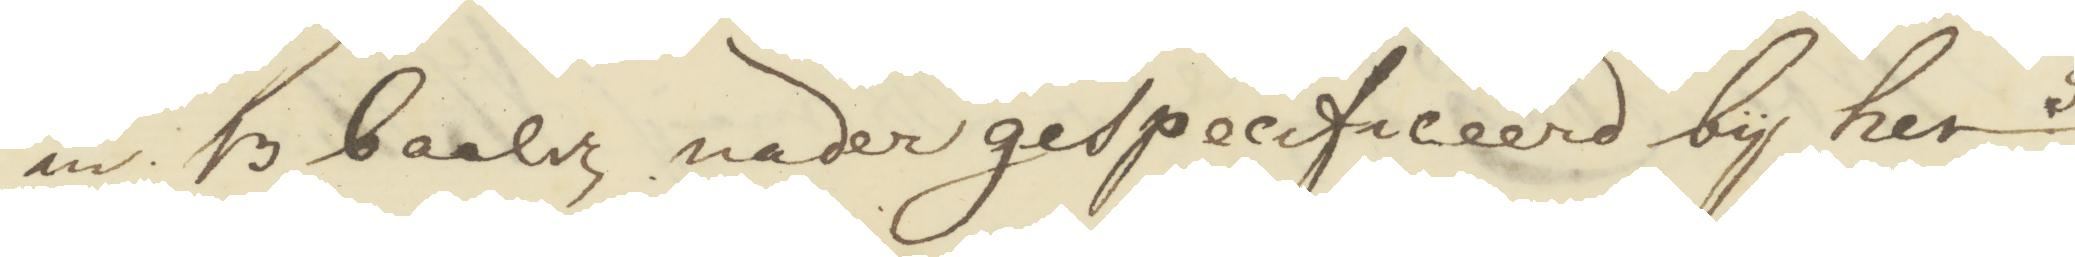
in 13 baalen nader gespecificeerd bij het
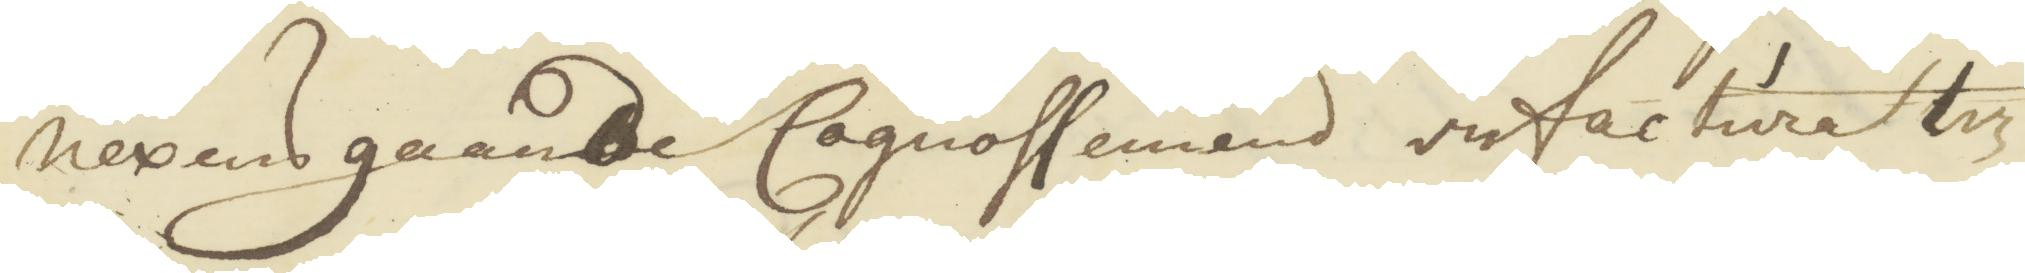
nevens gaande Cognossemend en factura ten
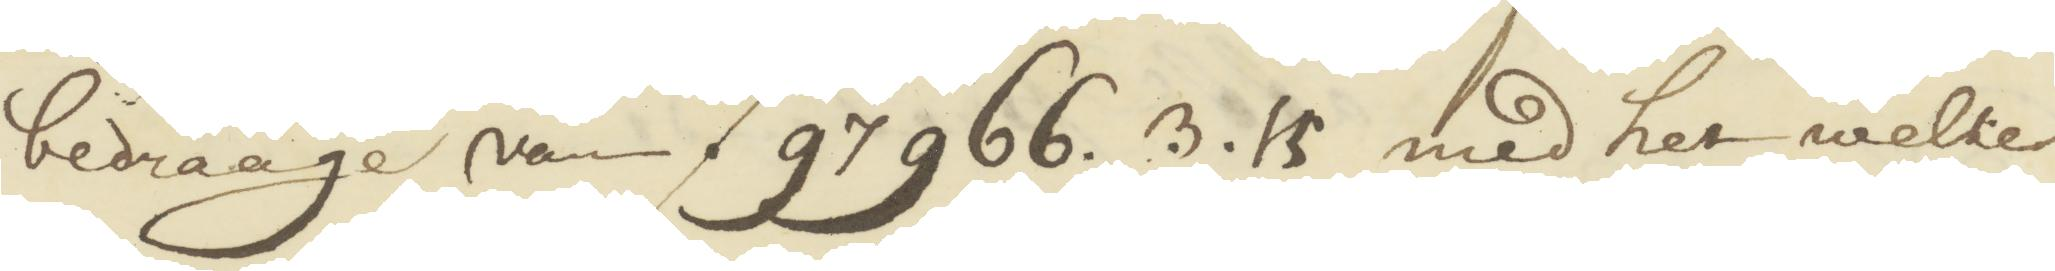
bedraage van ƒ97966.3.15 med het welke
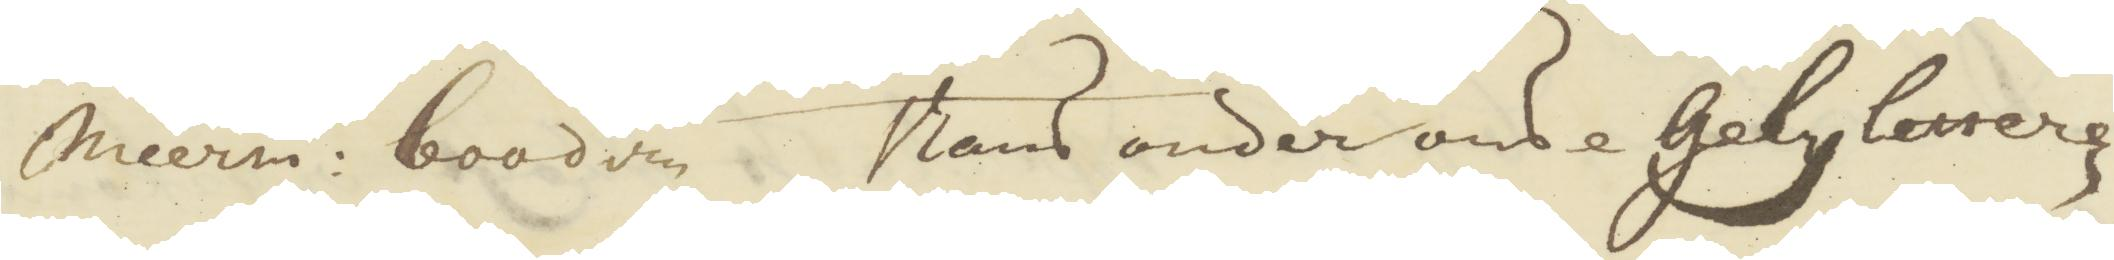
meerm: boodem thans onder onse gely letteren
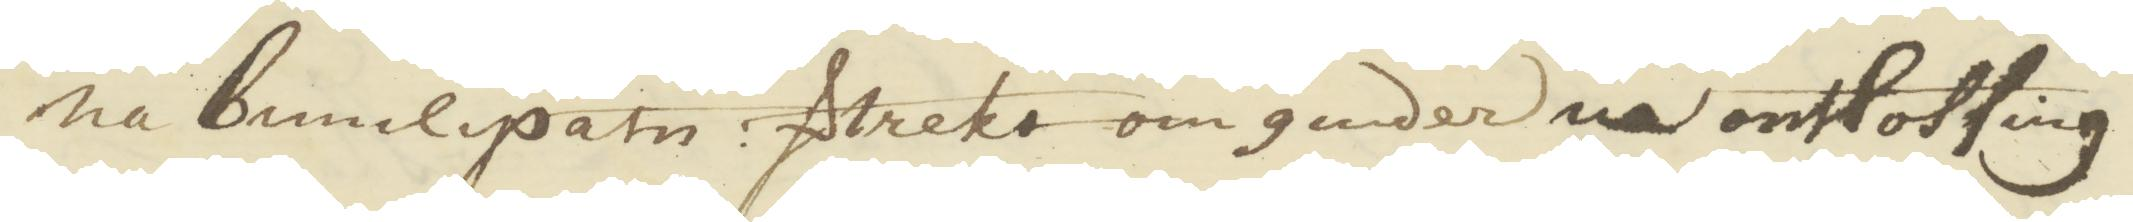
na bimilipatn: vertrekt om ginder na ontlossing
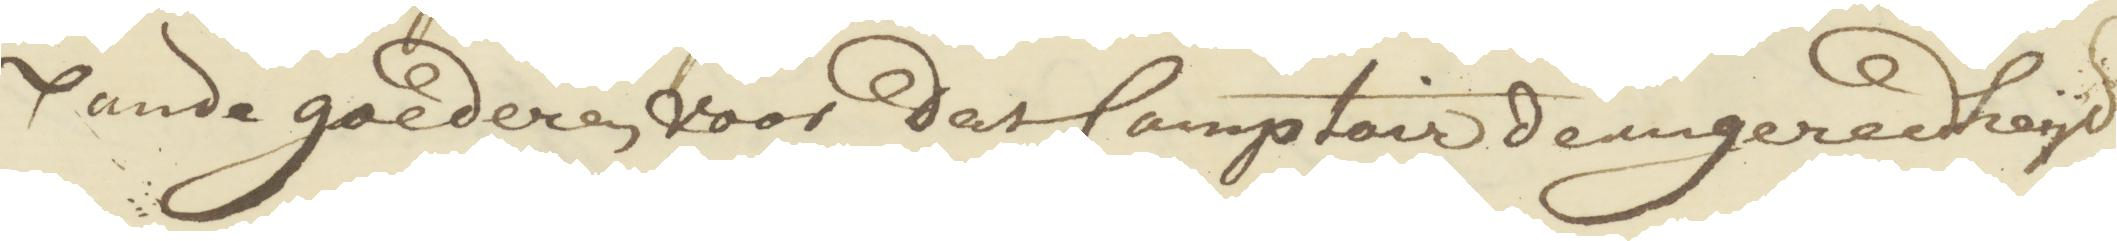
vande goederen voor dat Comptoir de in gereedheijd
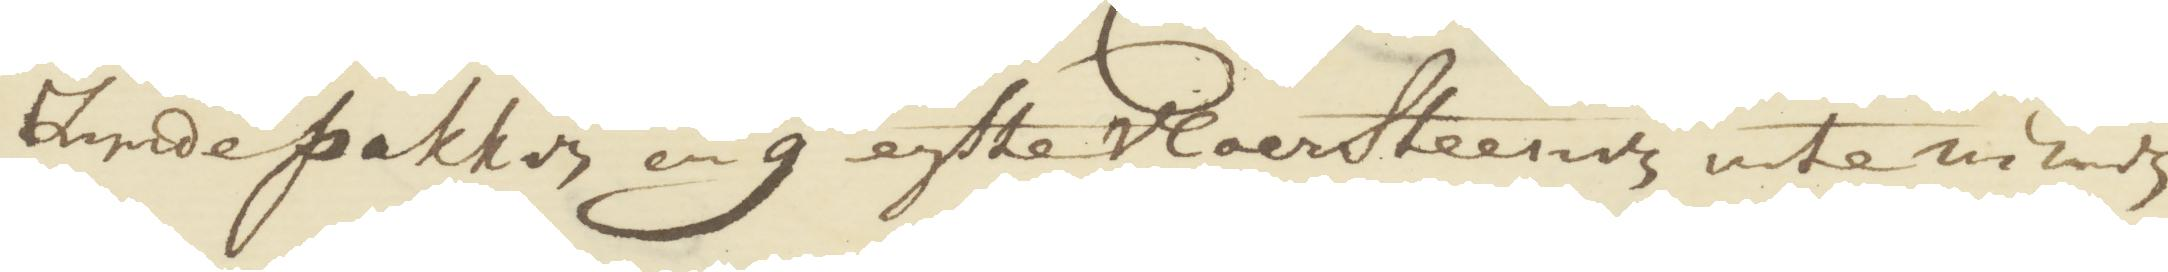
zynde pakken en g'eyste vloersteenen in te nemen
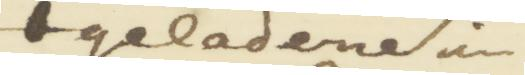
t geladene in
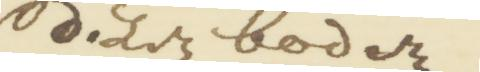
dezen bodem
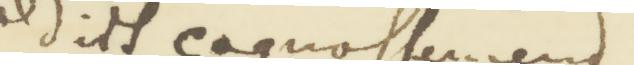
dits cognossemend
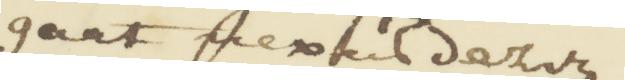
gaat nevens dezen
